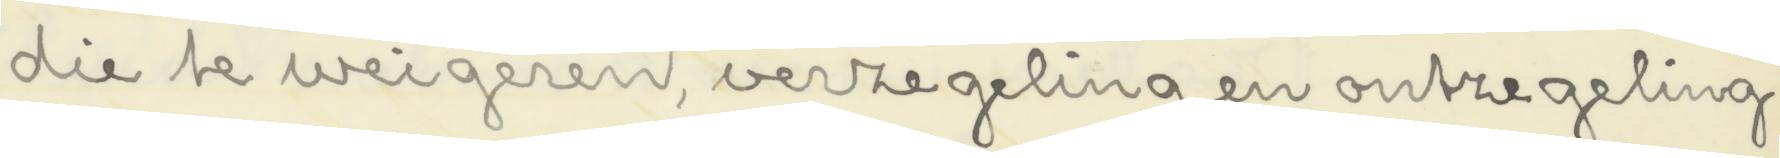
die te weigeren, verzegeling en ontzegeling
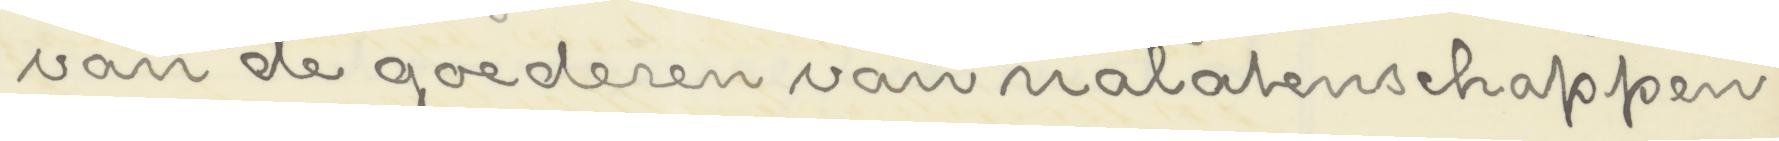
van de goederen van nalatenschappen
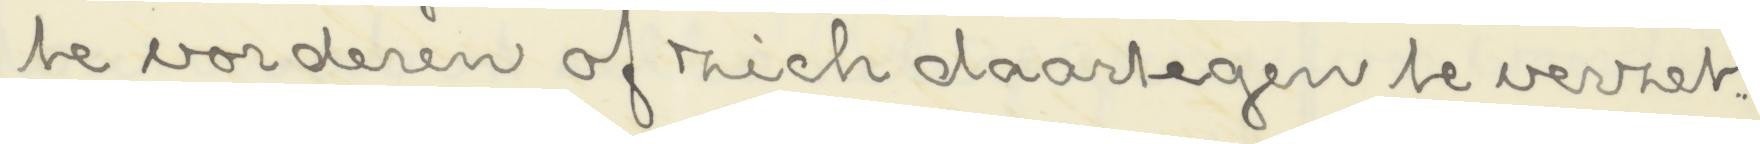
te vorderen of zich daartegen te verzet„
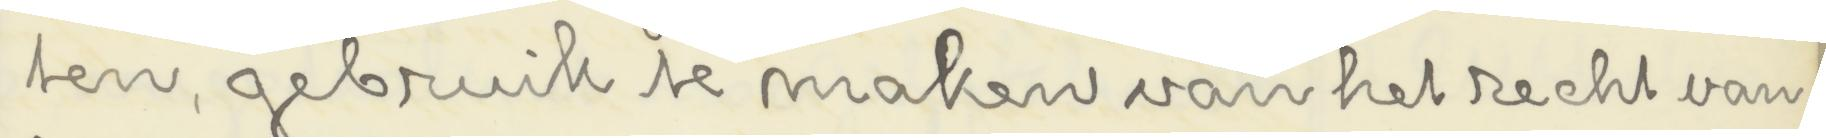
ten, gebruik te maken van het recht van
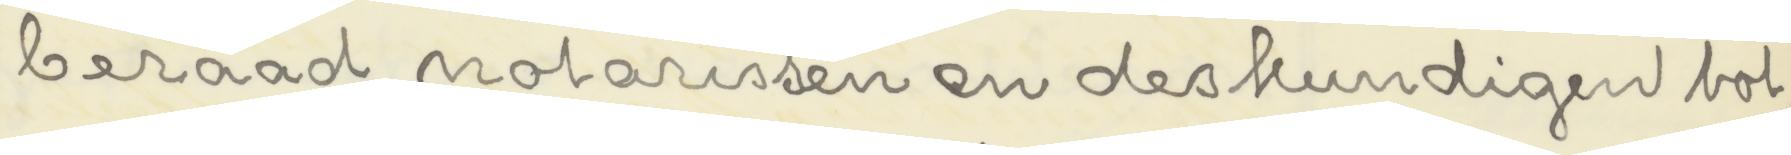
beraad, notarissen en deskundigen tol
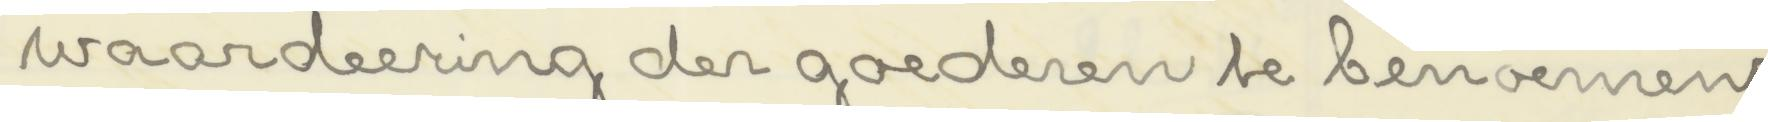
waardeering der goederen te benoemen,
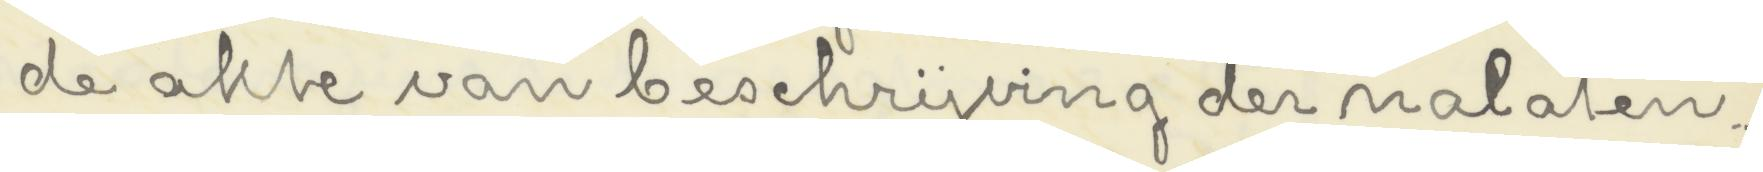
de akte van beschrijving der nalaten„
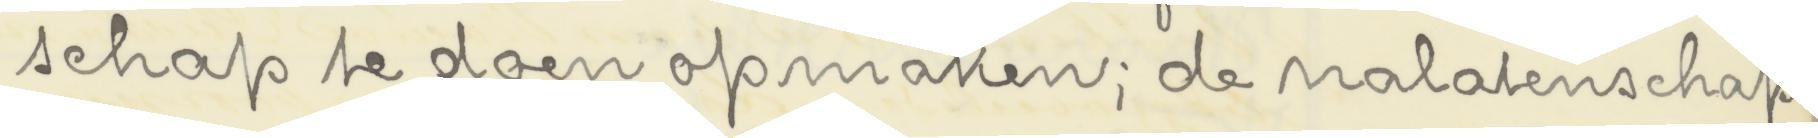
schap te doen opmaken; de nalatenschap
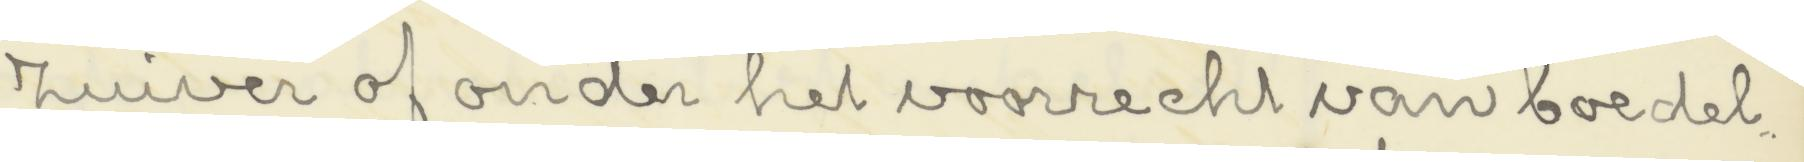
zuiver of onder het voorrecht van boedel„
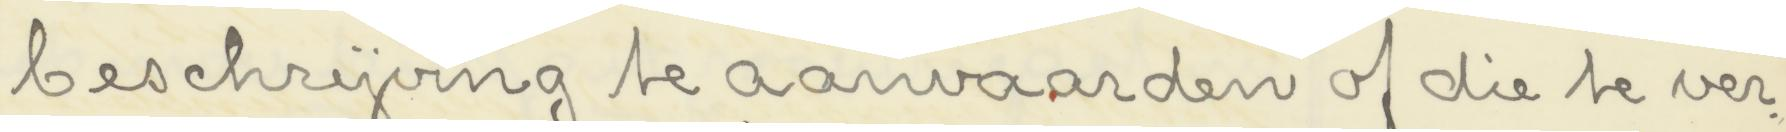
beschrijving te aanvaarden of die te ver„
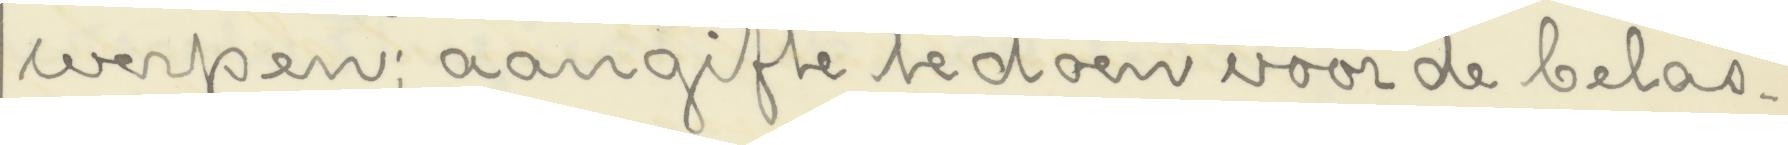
werpen; aangifte te doen voor de belas„
